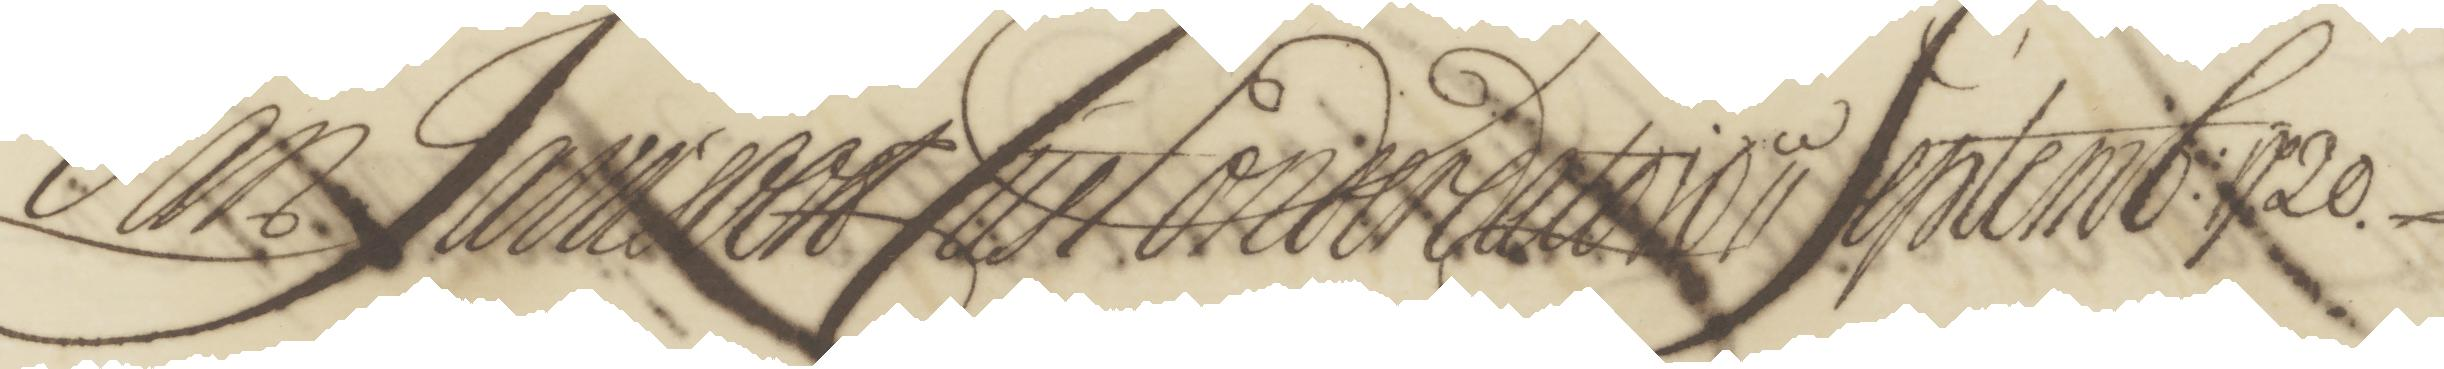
Van Javas oost Cust onder dato 10„e Septemb: 1720. —
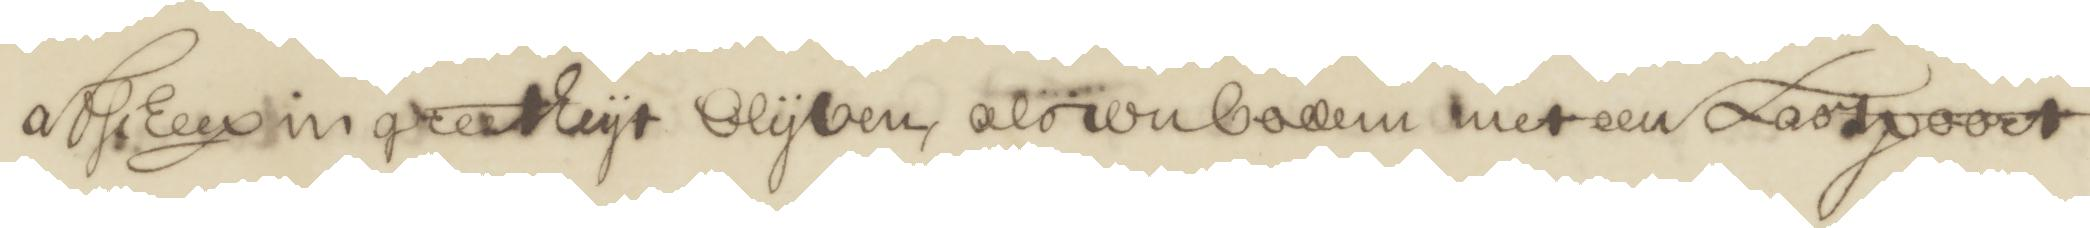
afscheep in greetheijt blijven, als een bollem met een Laatpoort
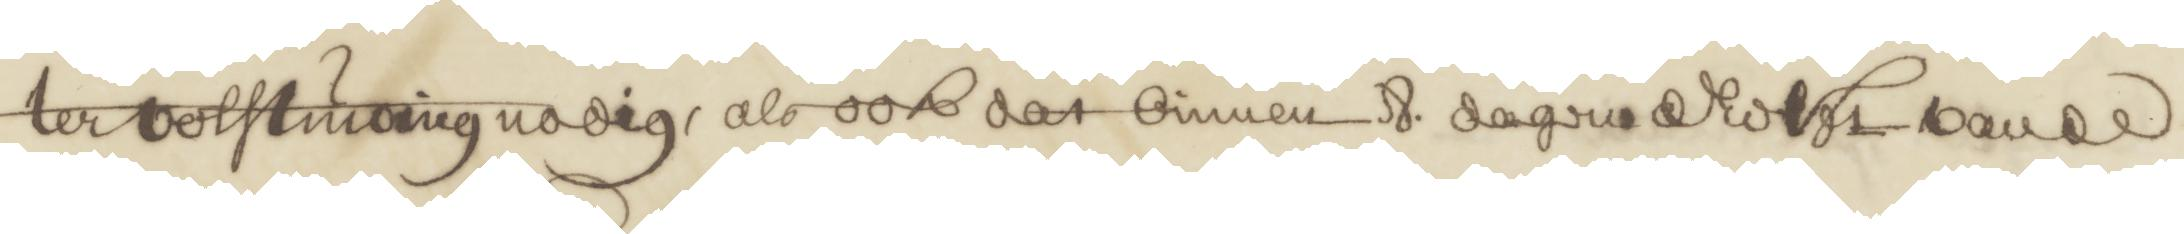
ter volstuwing nodig, als ook dat binnen 8. dagen de helft van de
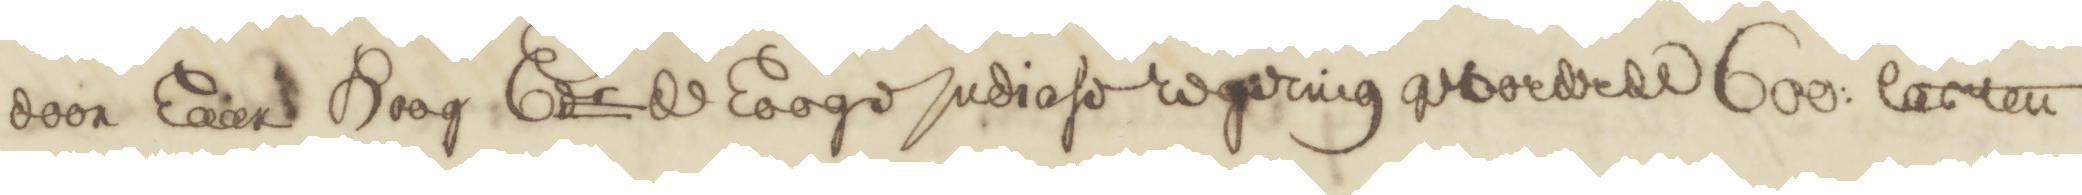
door haar Hoog Ed=s de hooge Jndiase regering gevorderde 600: lasten
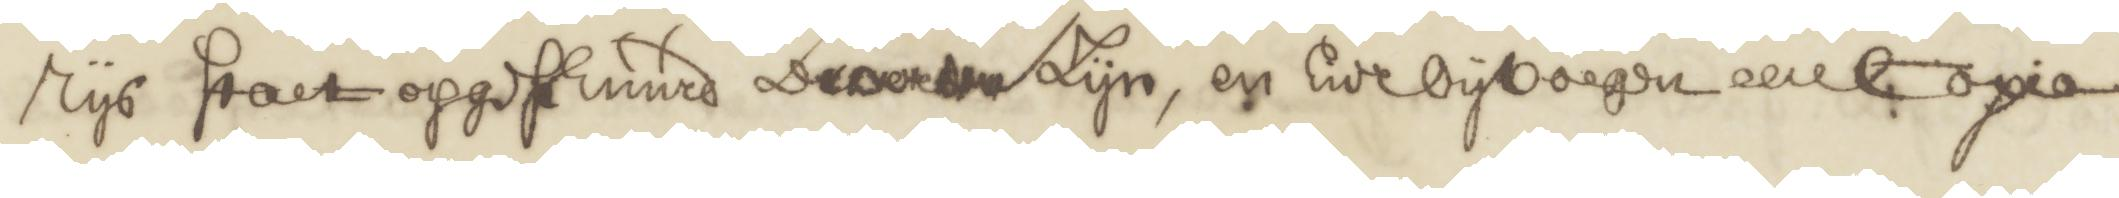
rijs staet opgeschuurd te worden zijn, en hier bij volgen een Copia
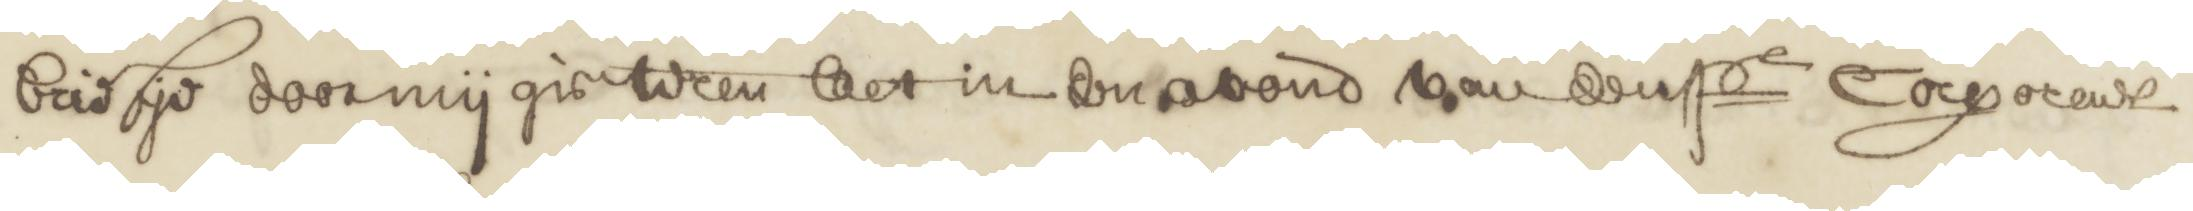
briefje door mij gisteren laet in den avond van den P=l Corporael
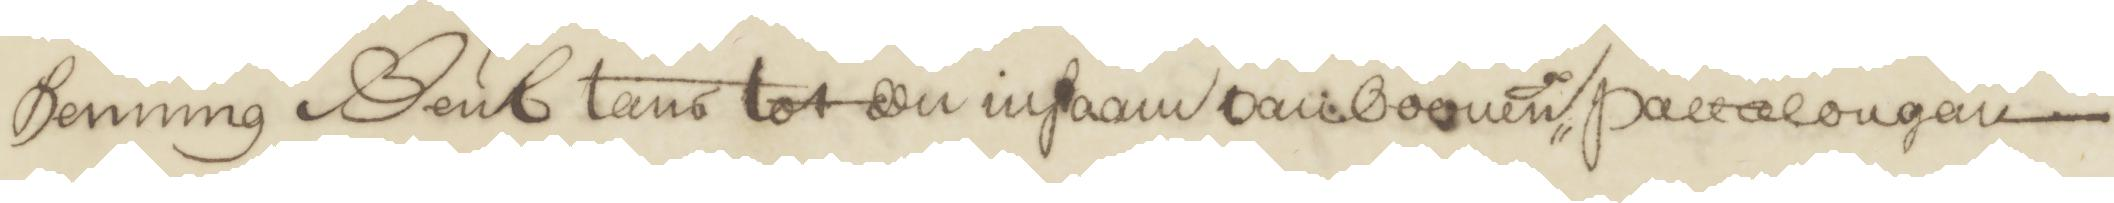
Benning Beuk tans tot den insaam van boonen„ge Paccalongan
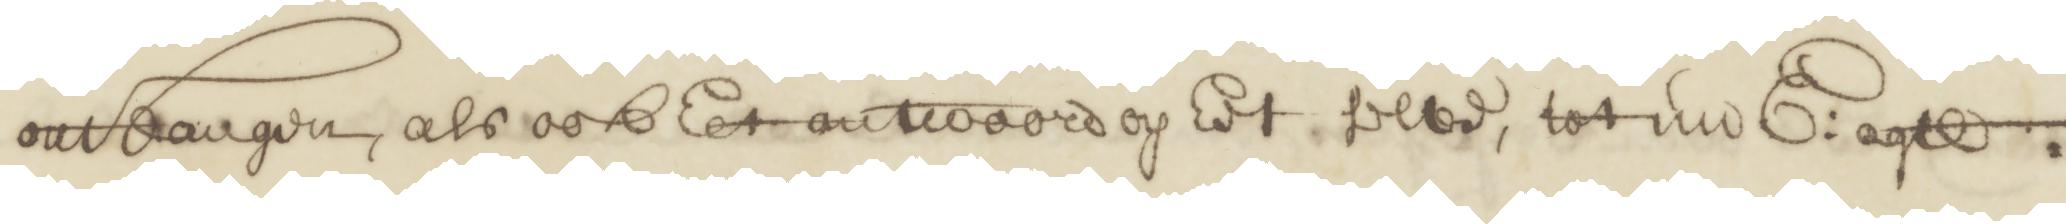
ontfangen, als ook het antwoord op het selve, tot uw E: agtb:
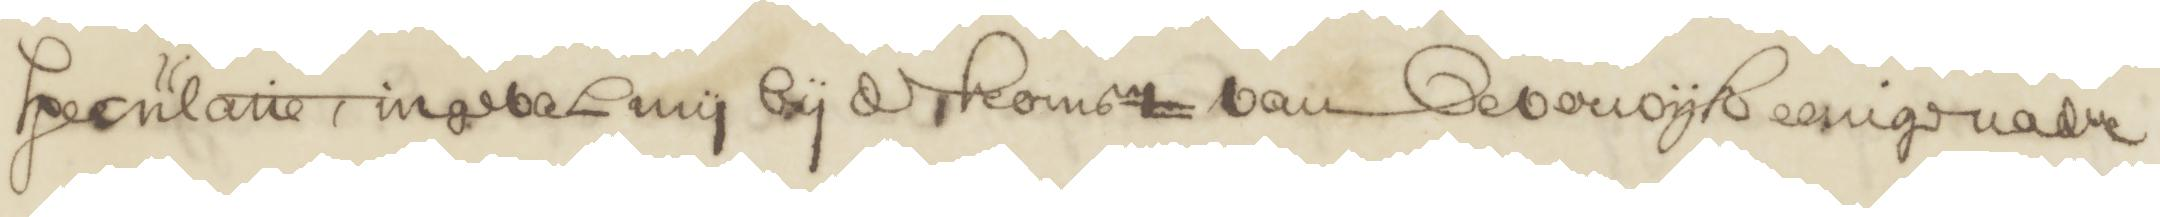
speculatie, ingeval mij bij de komst van Beverwijk eenige nader
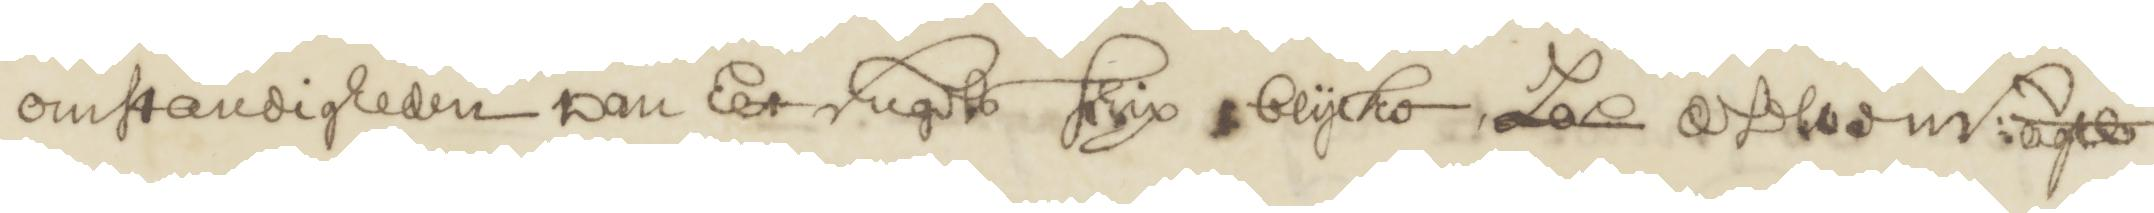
omstandigheden van het Engels schip blijcko, zal deselve uE: agtb
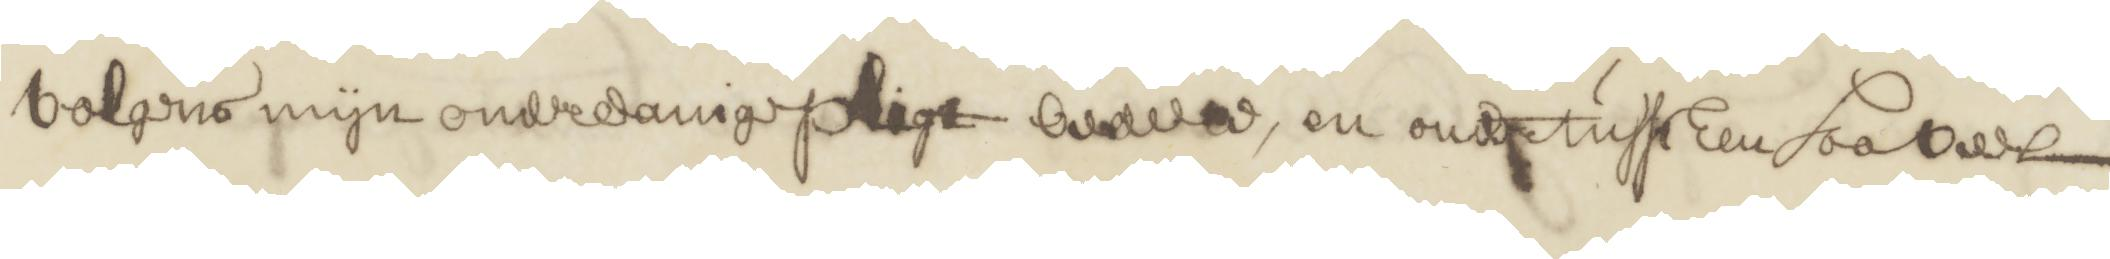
volgens mijn onderdanige pligt beveele, en ondertusschen soo veel
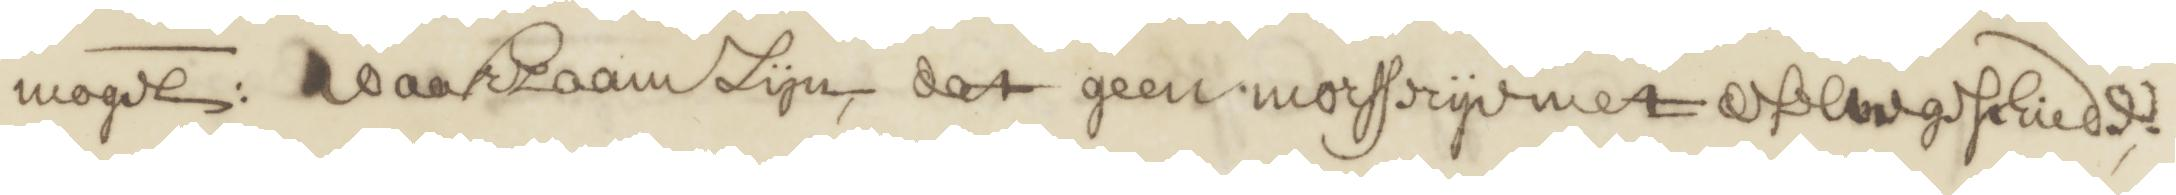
mogel: waakzaam zijn, dat geen morsserije met deselve geschiede.
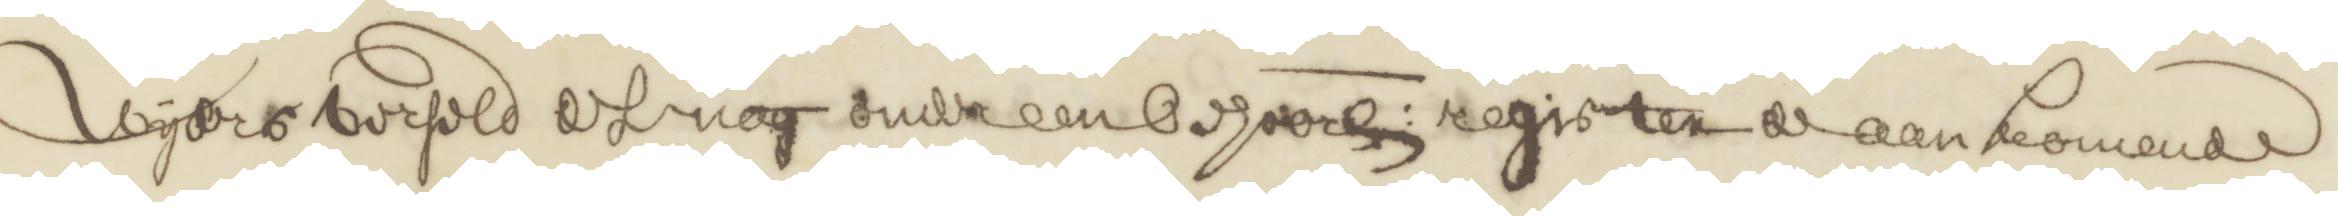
Wijders verseld dese nog onder een behooren: register de aan komende
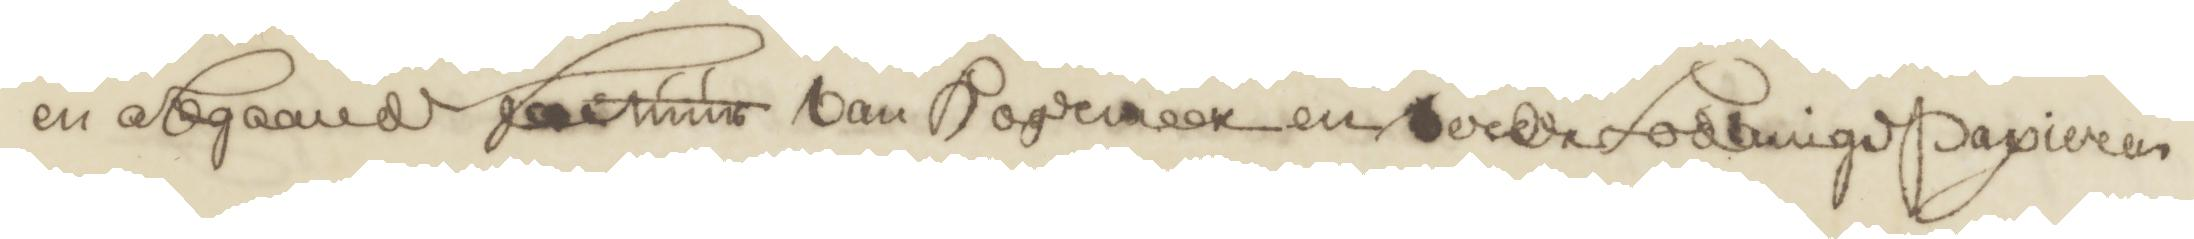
en afgaande factuur van Hoge weer en verder sodanige papieren
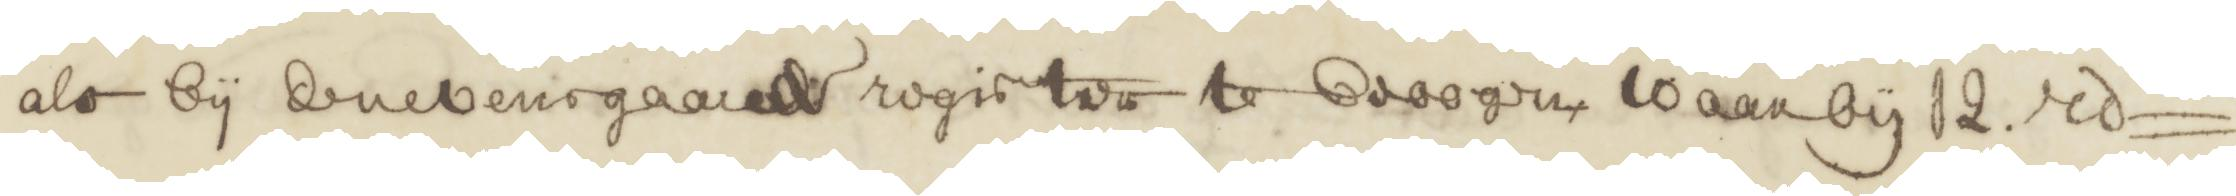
als bij de nevensgaande register te beoogen, waar bij 12. rd=s
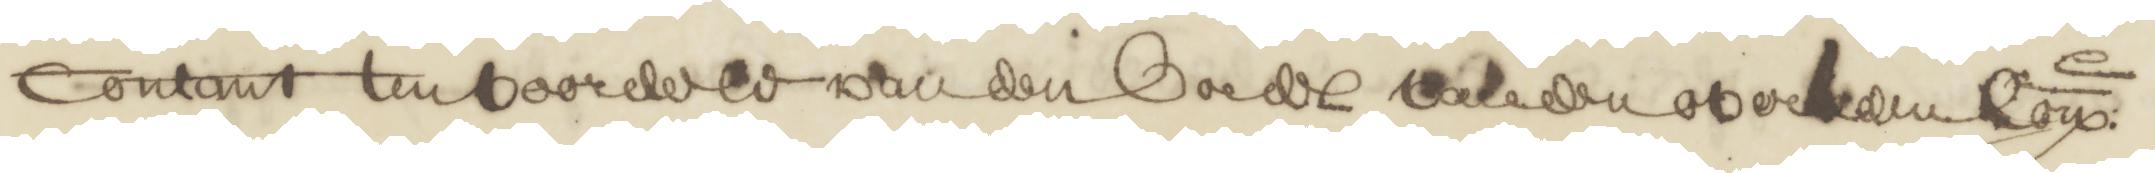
contant ten voordele van den boedel valeden overleden Corp:l
